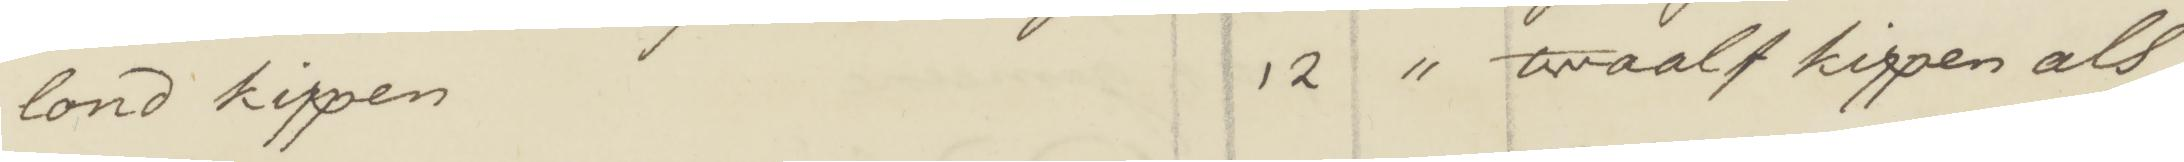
lond kippen 12 „ twaalf kippen als
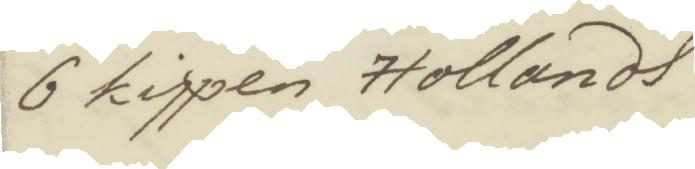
6 kippen Hollands
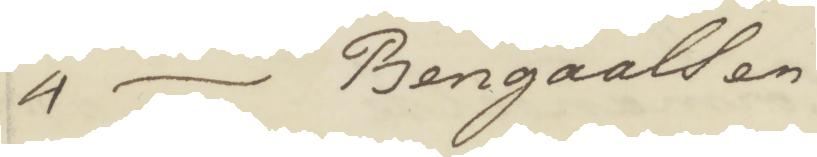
4 — Bengaals en
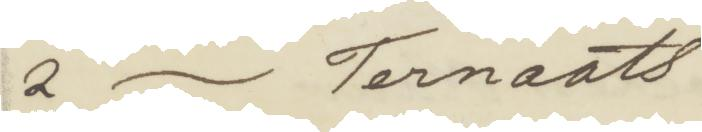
2 — Ternaats
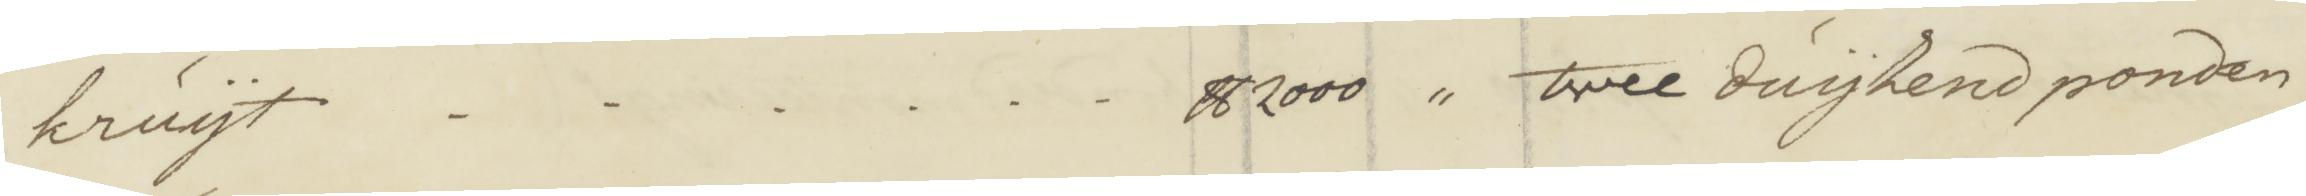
kruijt - - - - - - lb 2000 „ twee duijzend ponden
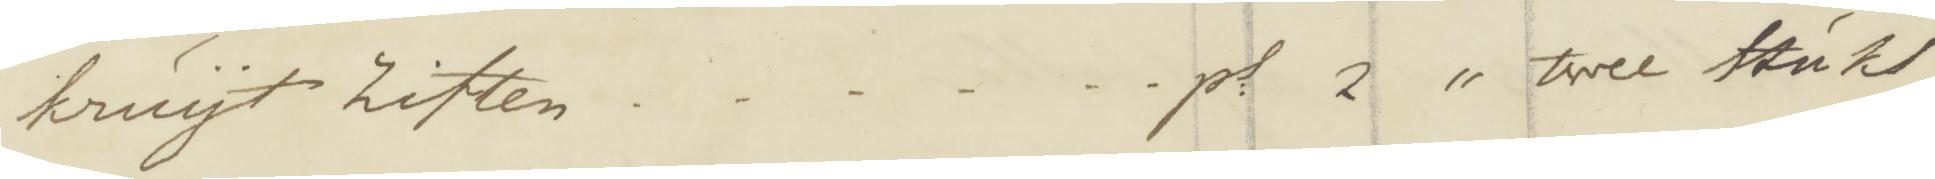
kruijt ziften - - - - - - p:s 2 „ twee stuks
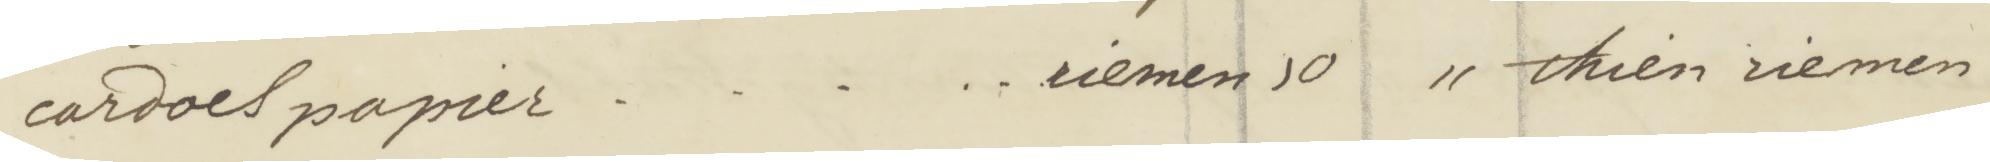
cardoes papier - - - . - riemen 10 „ thien riemen
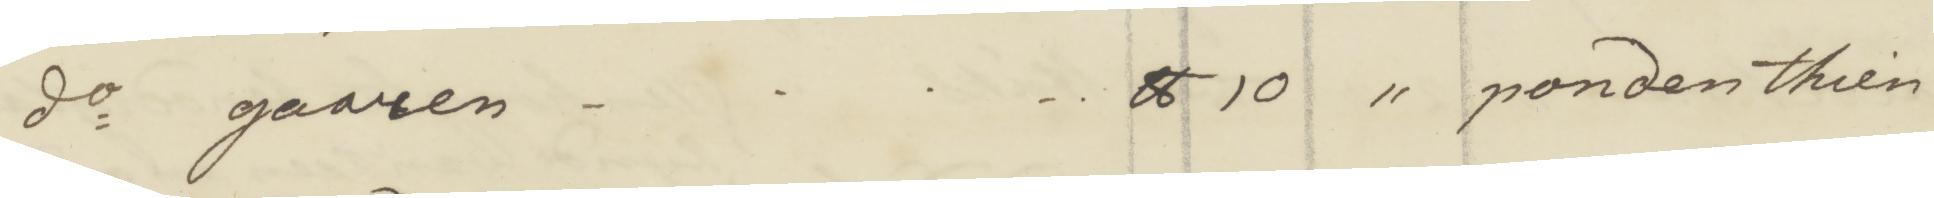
d=o gaaren - - - - . lb 10 „ ponden thien
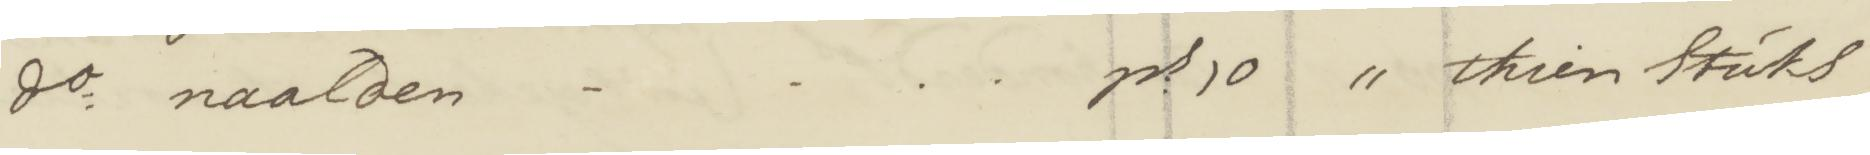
d=o naalden - - . . p:s 10 „ thien stuks
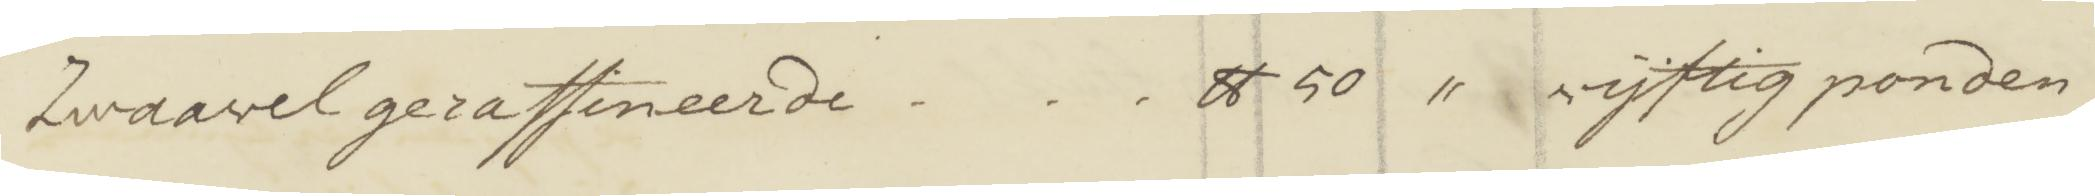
Zwaavel geraffeneerde - - - lb 50 „ vijftig ponden
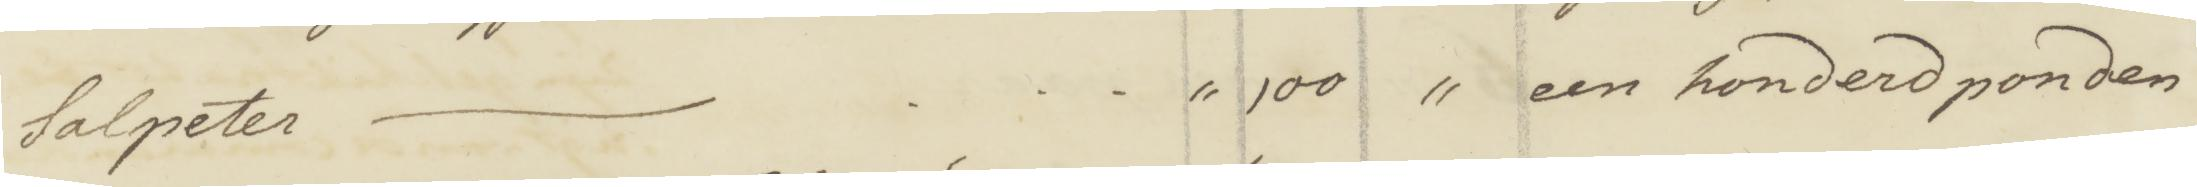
salpeter — - - - „ 100 „ een honderd ponden
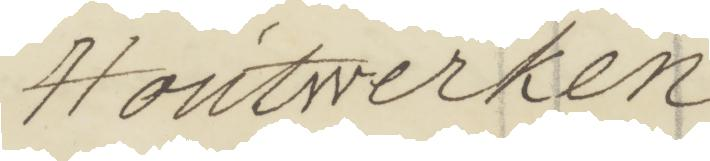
Houtwerken
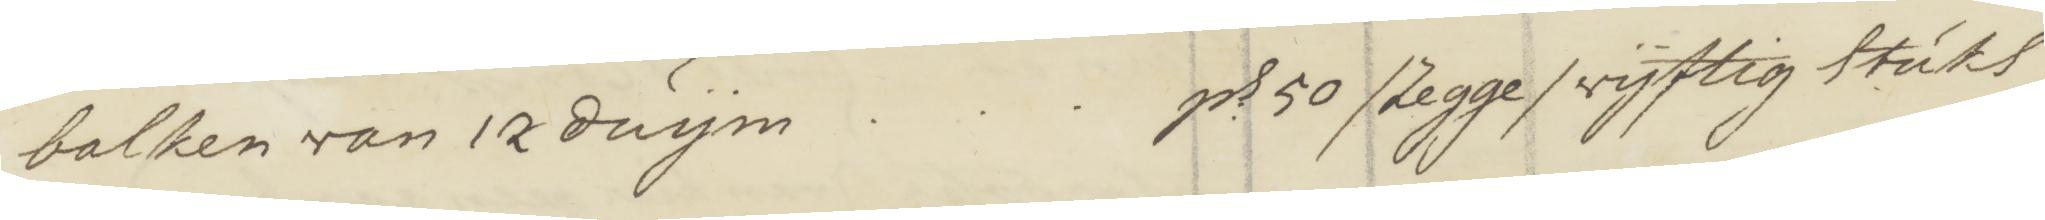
balken van 12 duijm . . . p:s 50 /zegge/ vijftig stuks
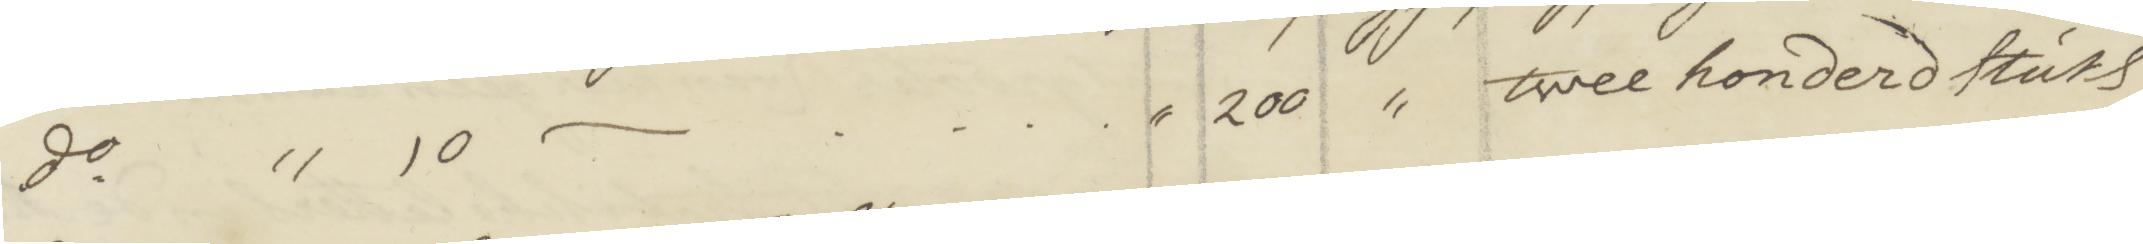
d.o „ 10 — „ 200 . - . . „ 200 „ twee honderd stuks
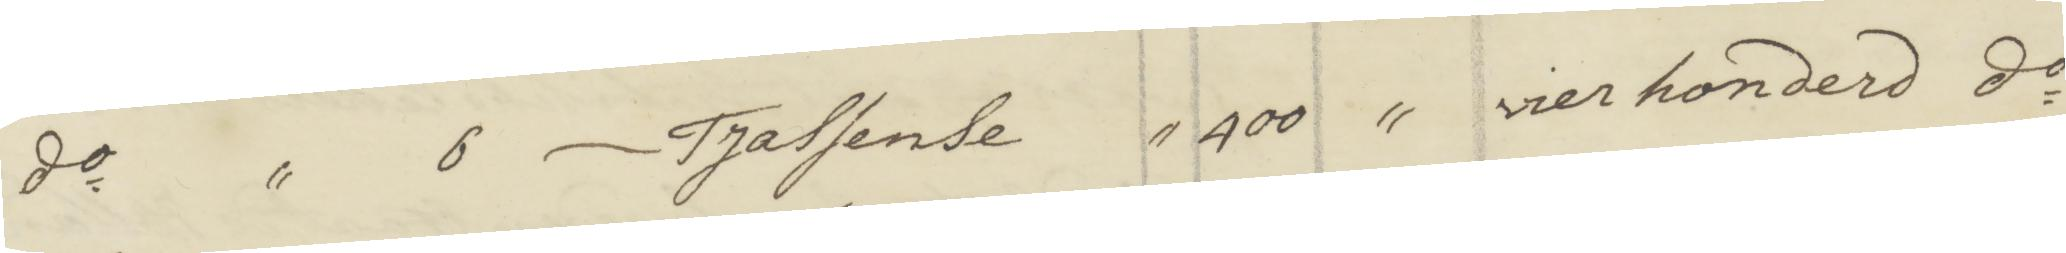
d=o „ 6 — Tjassense „ 400 „ vier honderd d=o
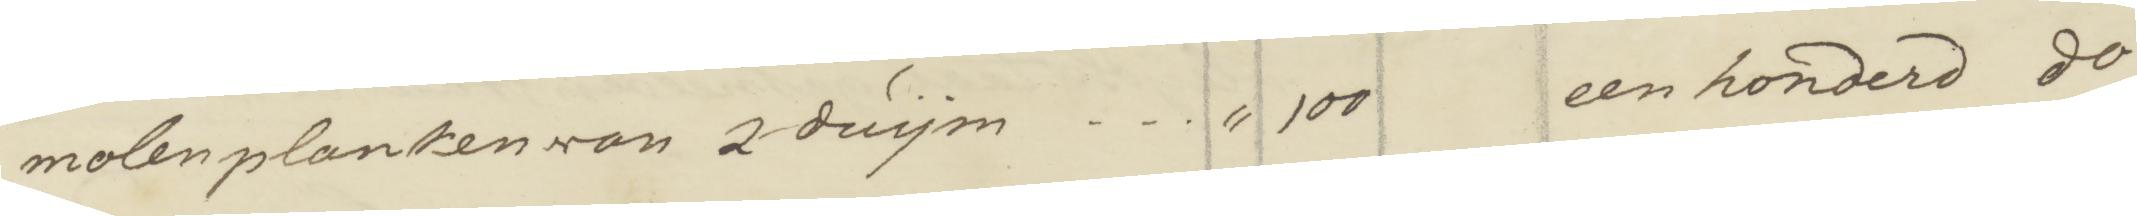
molen planken van 2 duijm - - . „ 100 een honderd d=o
